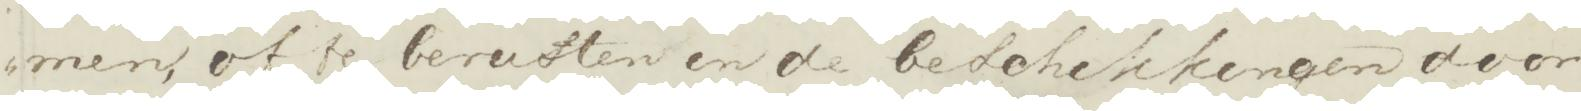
„men, of te berusten in de beschikkingen door
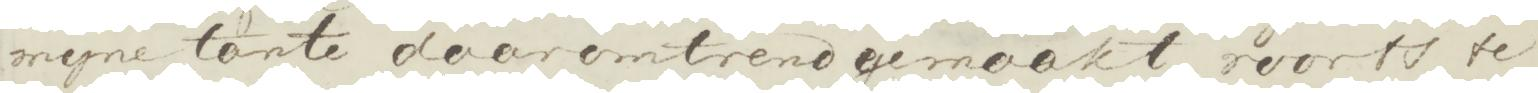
myne tante daar omtrend gemaakt voorts te
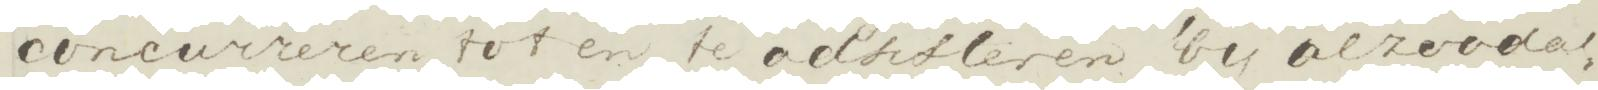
concurreren tot en te adsisteren by alzooda
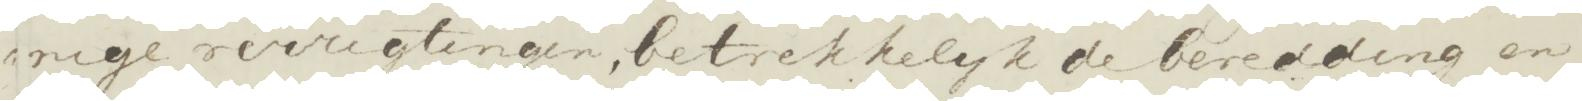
nige verrigtingen, betrekkelyk de beredding en
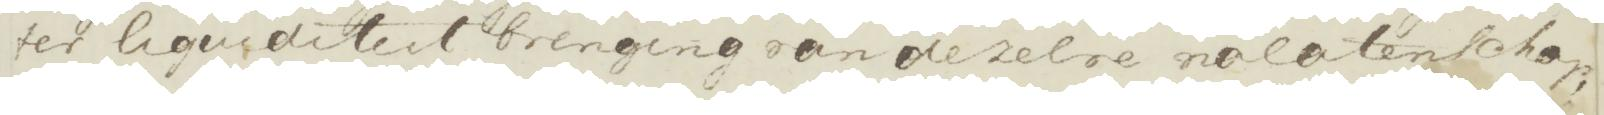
ter liquiditeit brenging van dezelve nalatenschap,
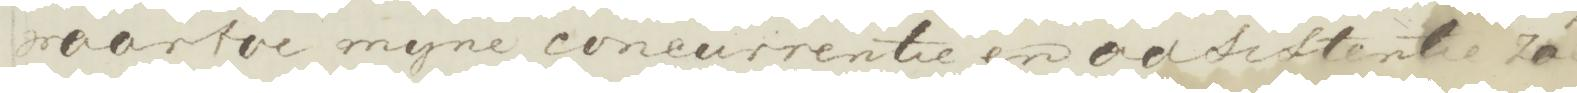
waartoe myne concurrentie en adsistentie za
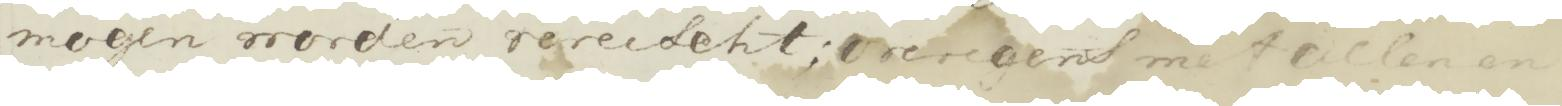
mogen worden vereischt, overigens met allen en
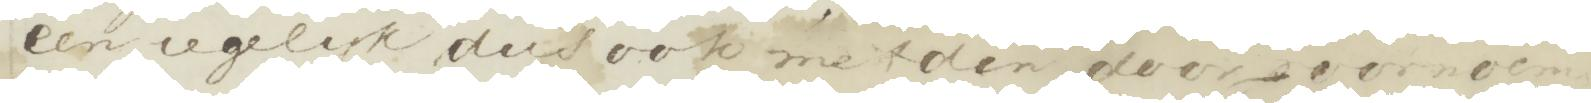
een iegelyk, dus ook met den door voornoem
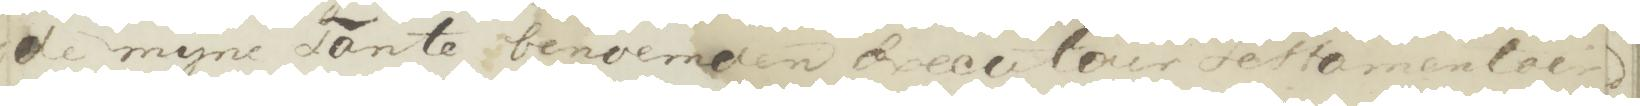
de myne Tante benoemden Executair Testamentair
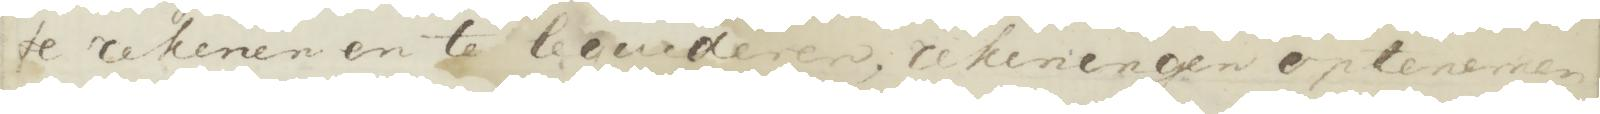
te rekenen en te liquideren, rekeningen op te nemen
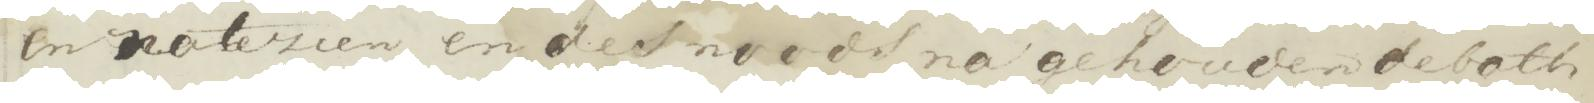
en na te zien en desnoods na gehouden debath
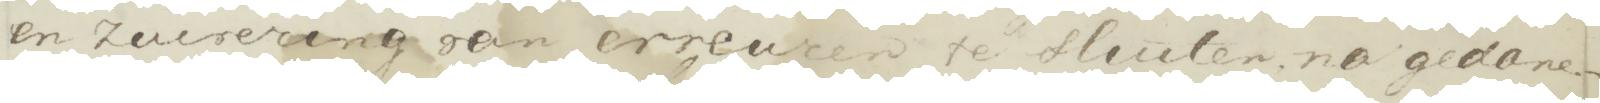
en zuivering van erreuren te sluiten, na gedane
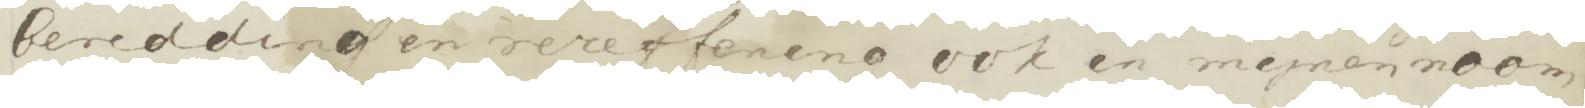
beredding en vereffening ook in mynen naam
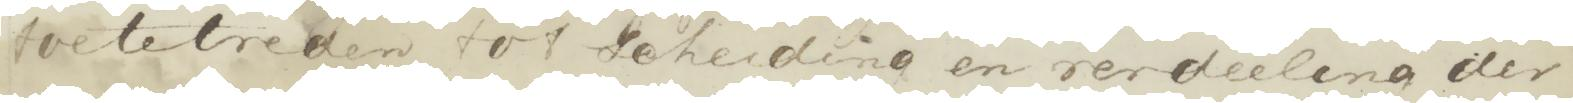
toetetreden tot scheding en verdeeling der
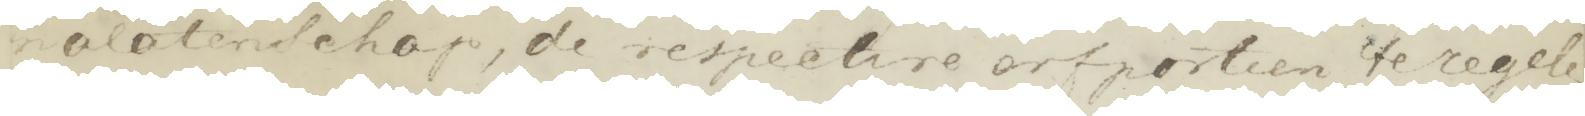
nalatenschap, de respective erfportien te regel
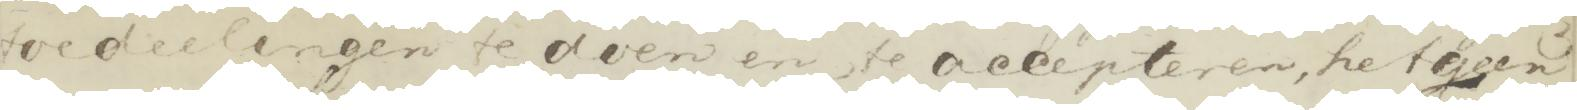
toedeelingen te doen en te accepteren, hetgeen
